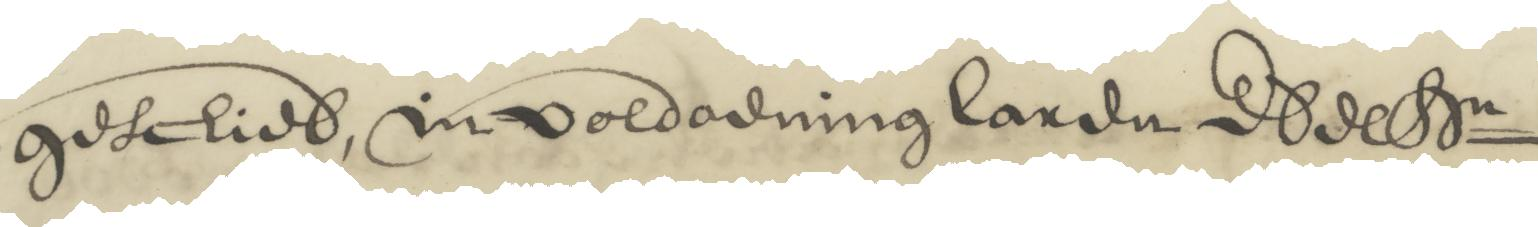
geschied, in voldoening haren Edelh=n
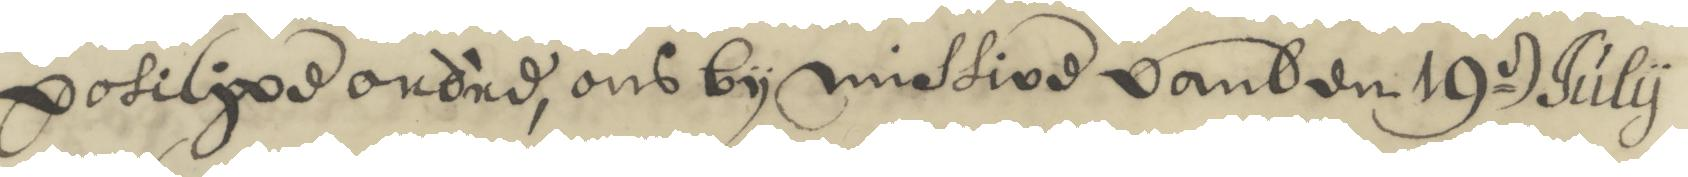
positive ordre, ons bij missive van den 19=en Iulij
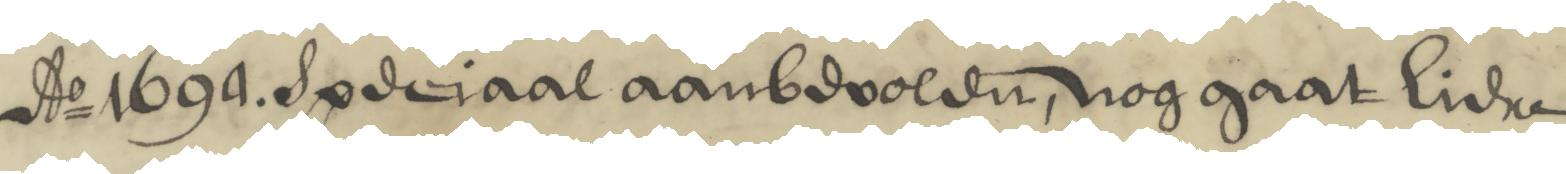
A=o 1694. speciaal aanbevolen, nog gaat hier
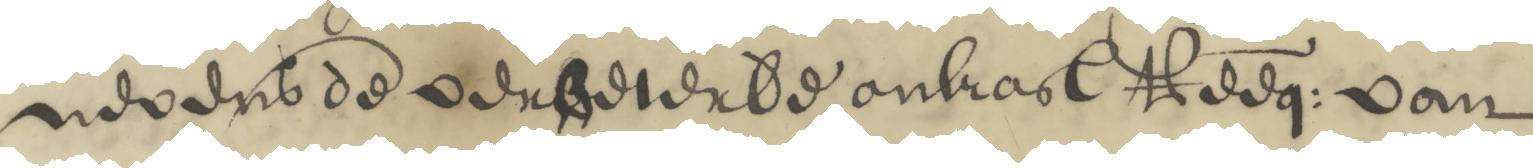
nevens de verbeterde onkost Reeq: van
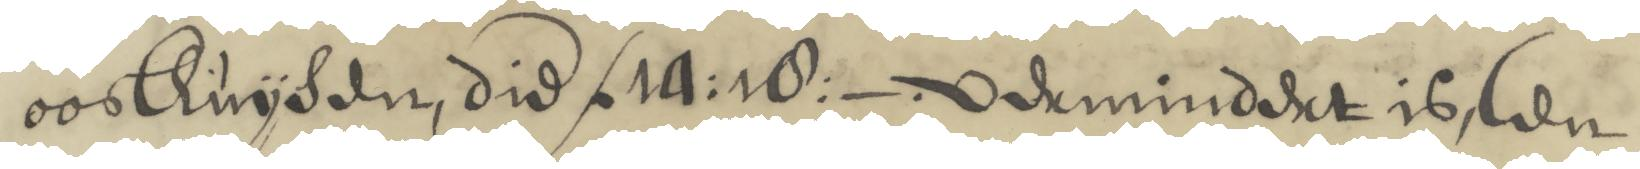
oosthuijsen, die ƒ14:18:—. vermindert is, ten
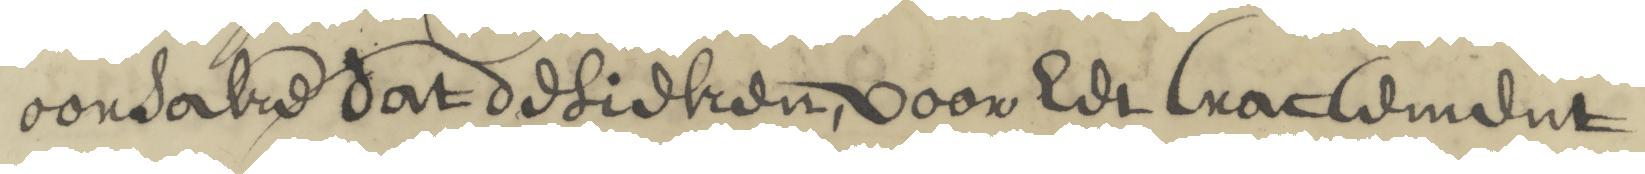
oorsake dat desieken, voor het tractement
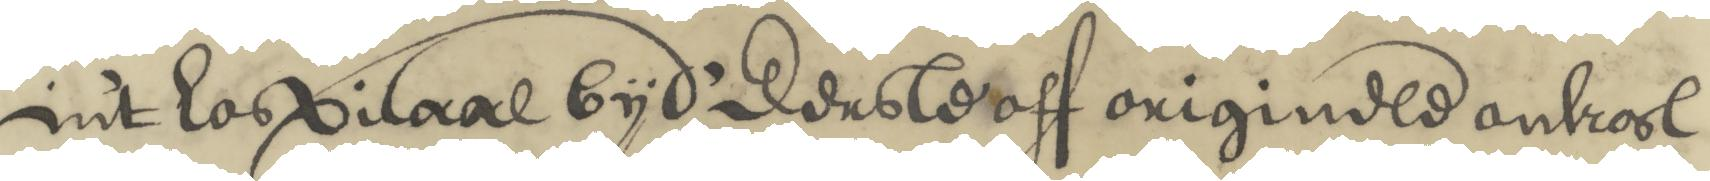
in’t hospitaal bij d’ Eerste off originele onkost
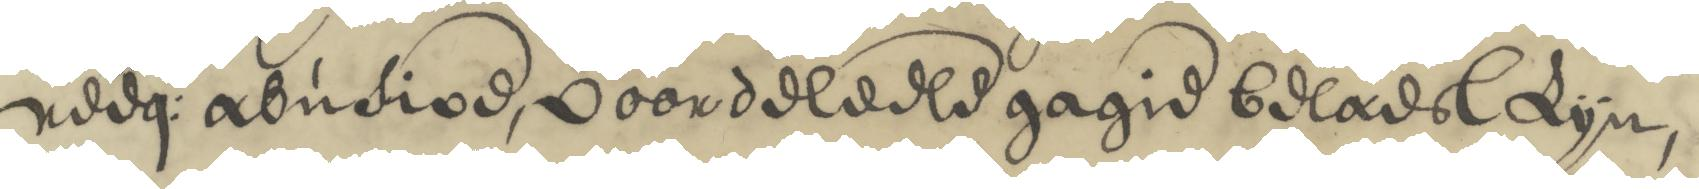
reeq: abusive, voor deheele gagie belaest zijn,
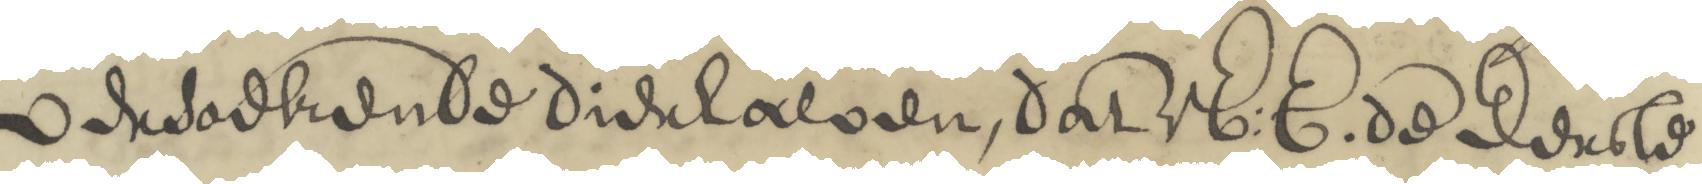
versoekende dierhalven, dat VE:E. de Eerste
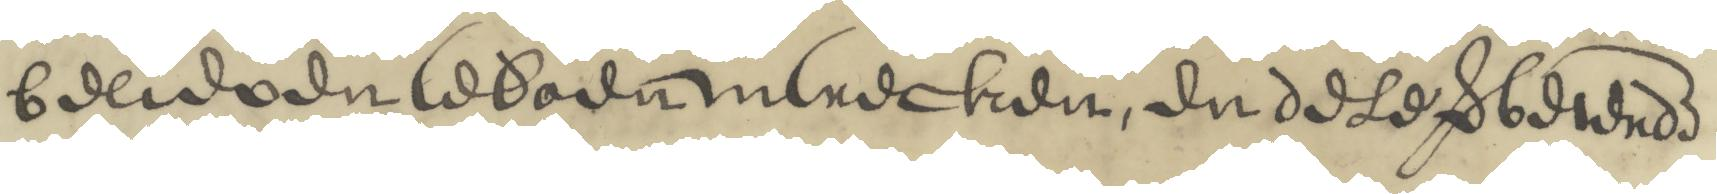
believen tedoen intrecken, en dese verbeterde
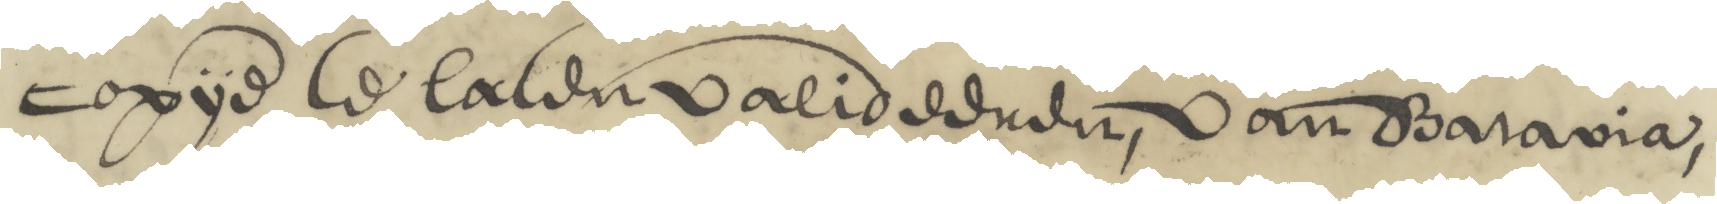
copije te laten valideeren, van Batavia,
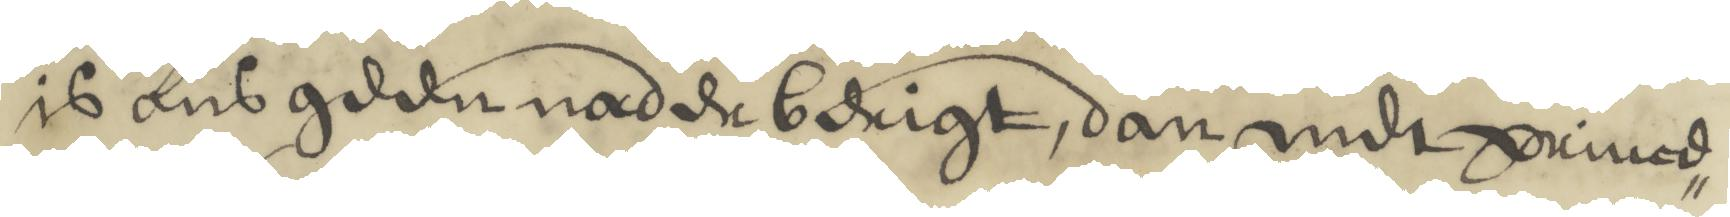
is ons geen nader berigt, dan met prince„
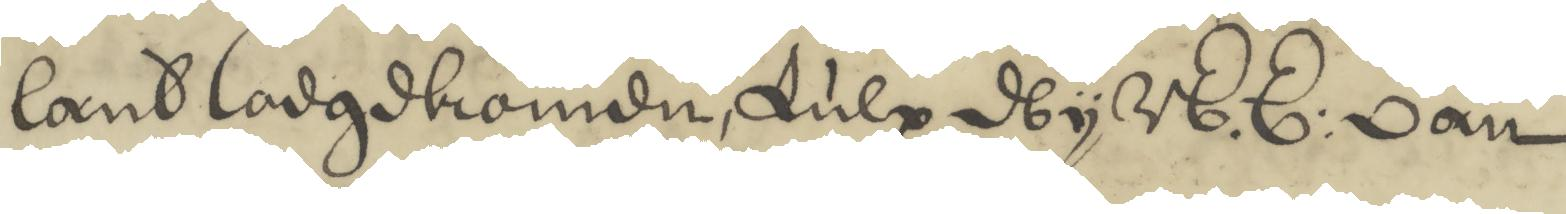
land toegekomen, zulx wij VE.E: van
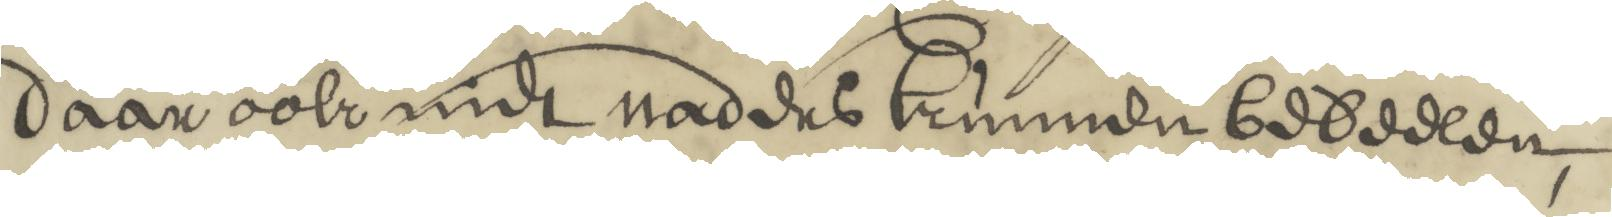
daar ook niet naders kunnen bedeelen,
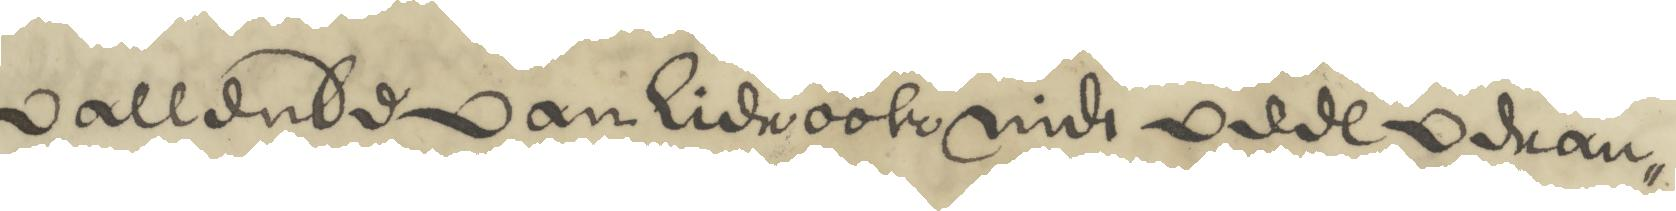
vallende van hier ook niet veel veran„
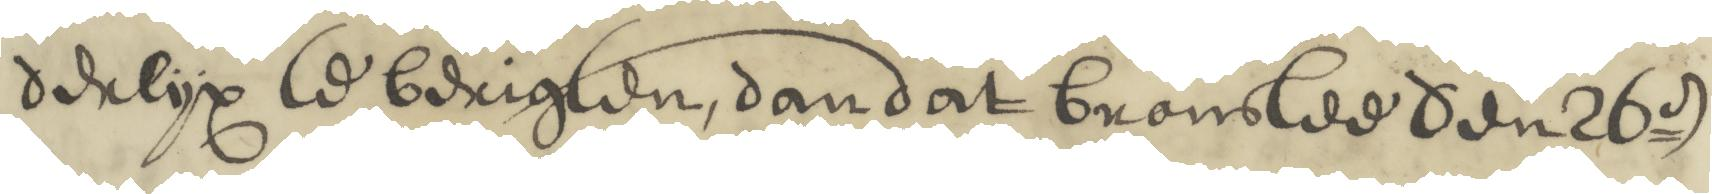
derlijx te berigten, dan dat bronstee den 26=en
